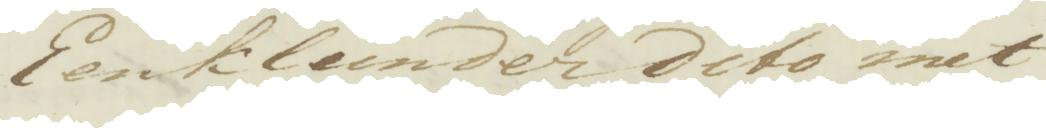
Een kleinder dito met
